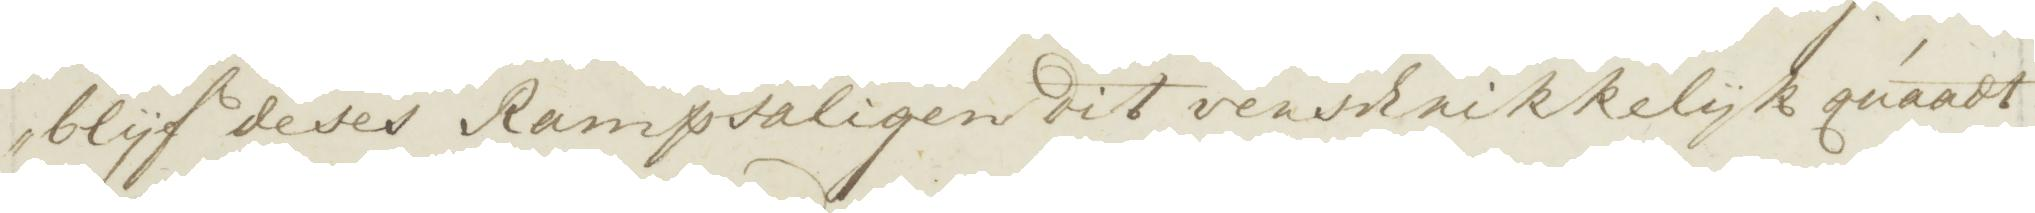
„blijf deses Rampsaligen dit verschrikkelijk quaadt
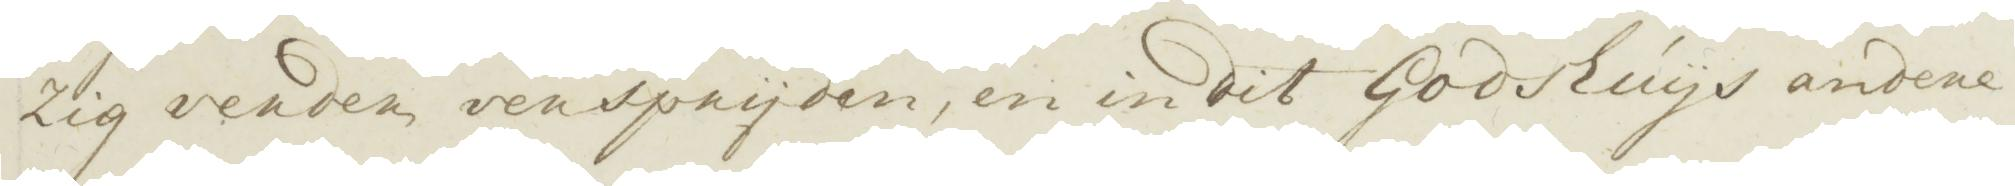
zig verder versprijden, en in dit Godshuijs andere
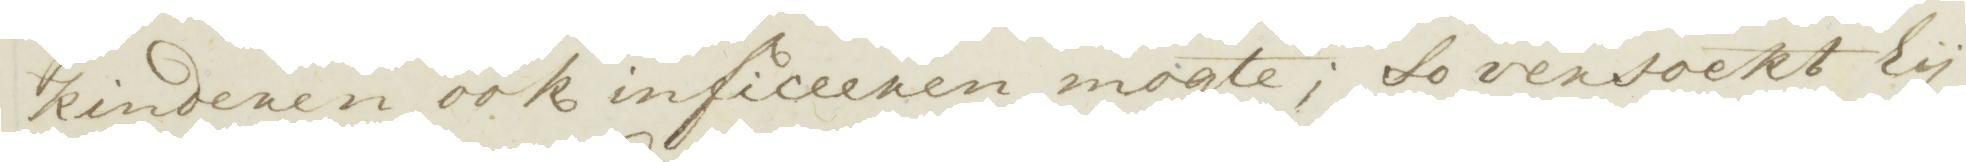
kinderen ook inficeeren mogte; so versoekt hij
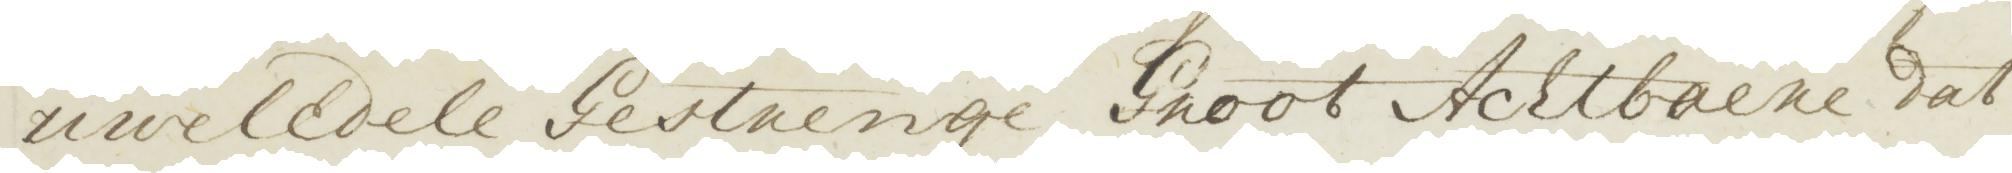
uwel Edele Gestrenge Groot Achtbaere dat
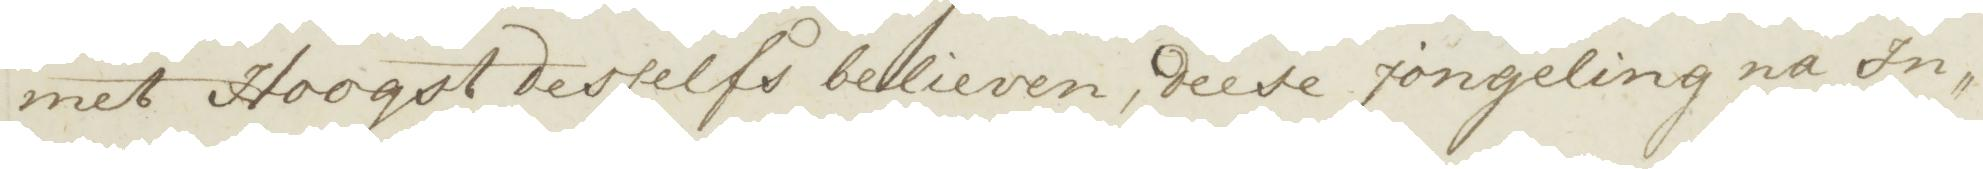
met Hoogst desselfs believen, deese jongeling na In„
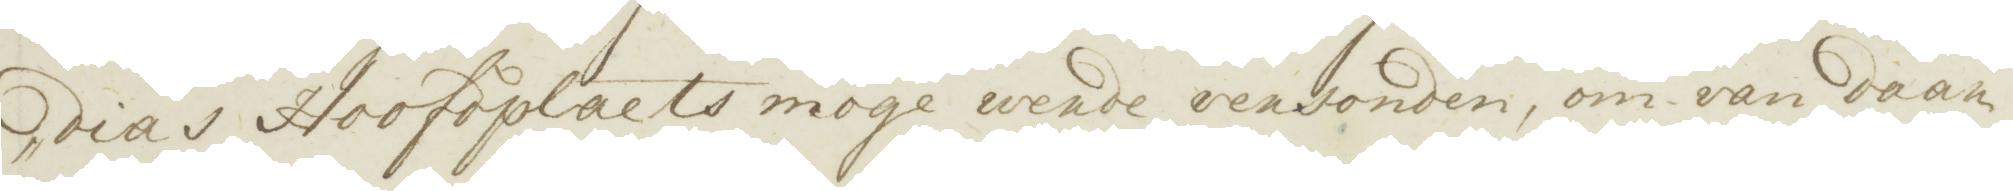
„dias Hoofdplaets moge werde versonden, om van daar
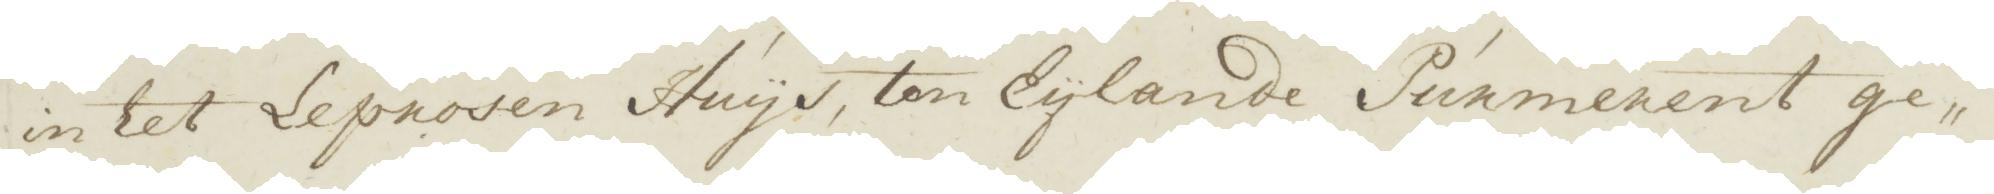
in het Leprosen Huijs, ten Eijlande Purmerent ge„
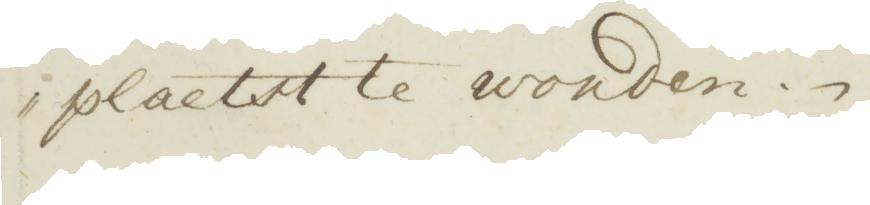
„plaetst te worden.
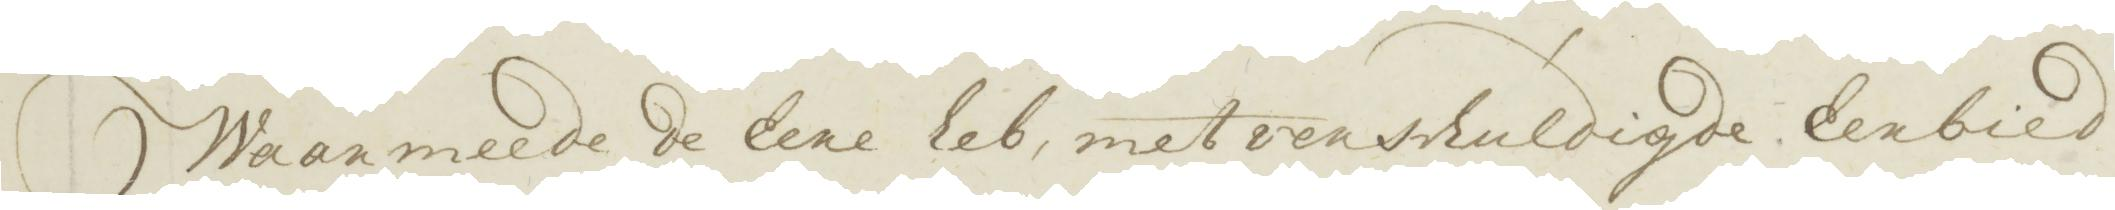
Waar meede de Eere heb, met verschuldigde Eerbied
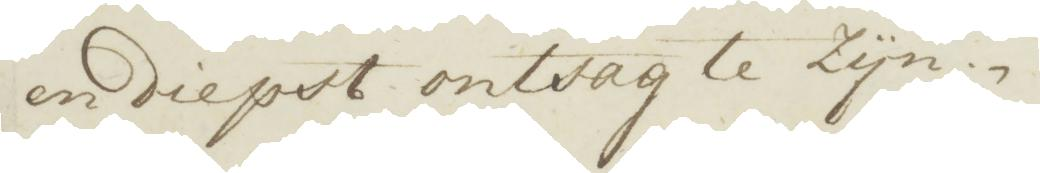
en diepst ontsag te Zijn.-
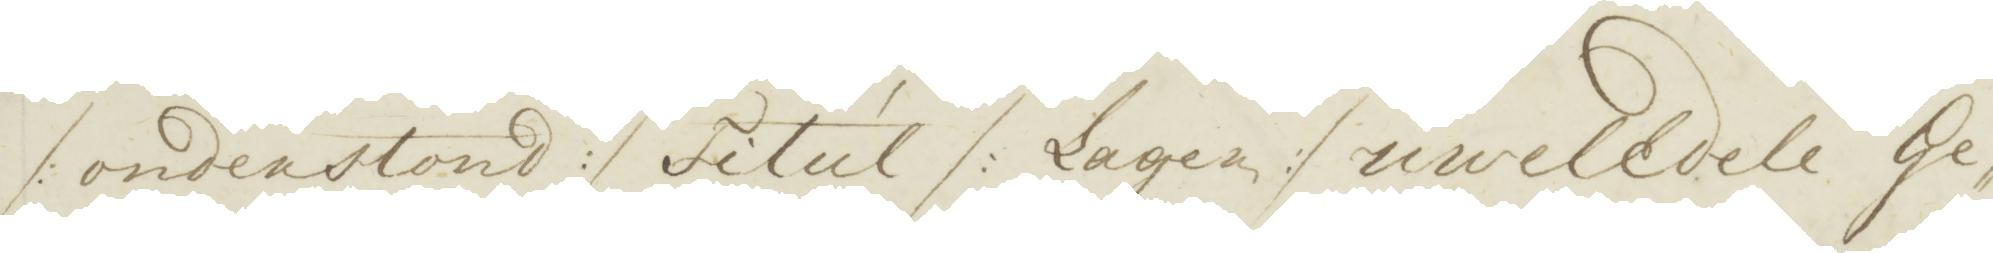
/: onderstond :/ Titul /: Lager:/ uwel Edele Ge„
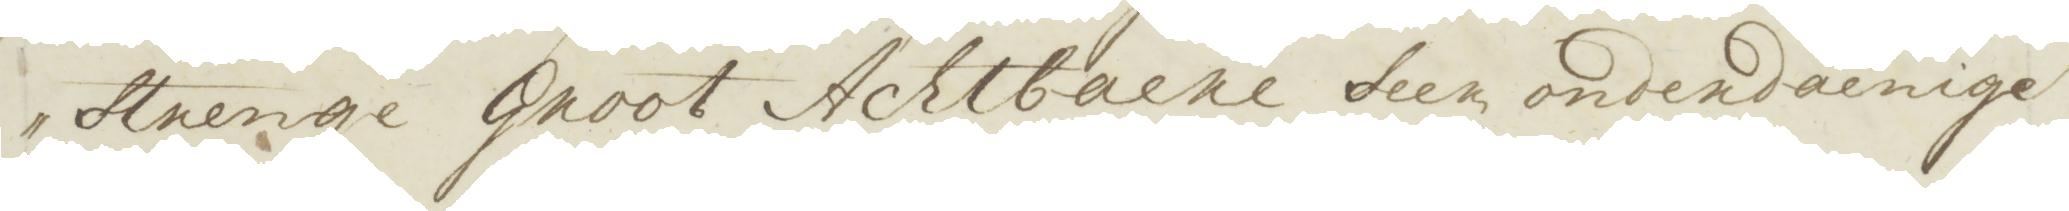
„Strenge groot Achtbaere Seer onderdaenige
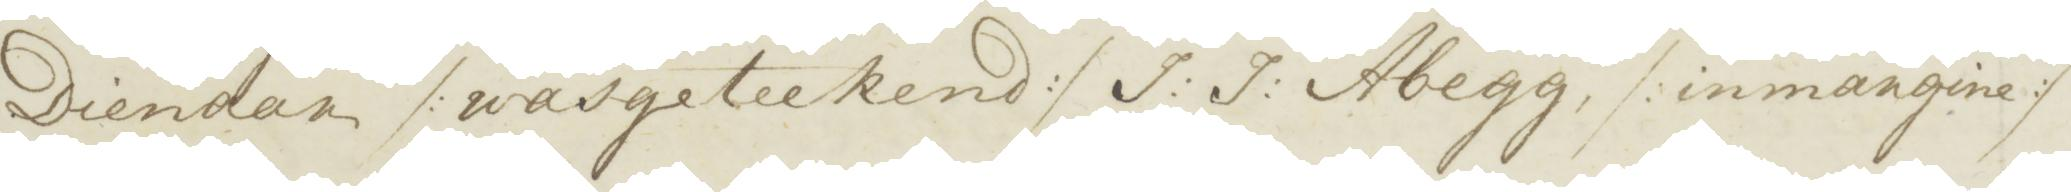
Dienaar /:was geteekend:/ I: I: Abegg, / :in margine :/
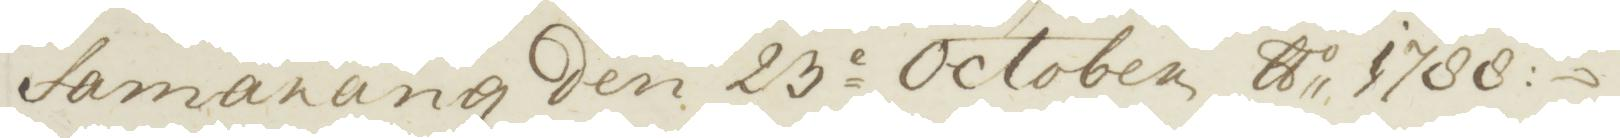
Samarang den 23=e October A„o 1788:—
